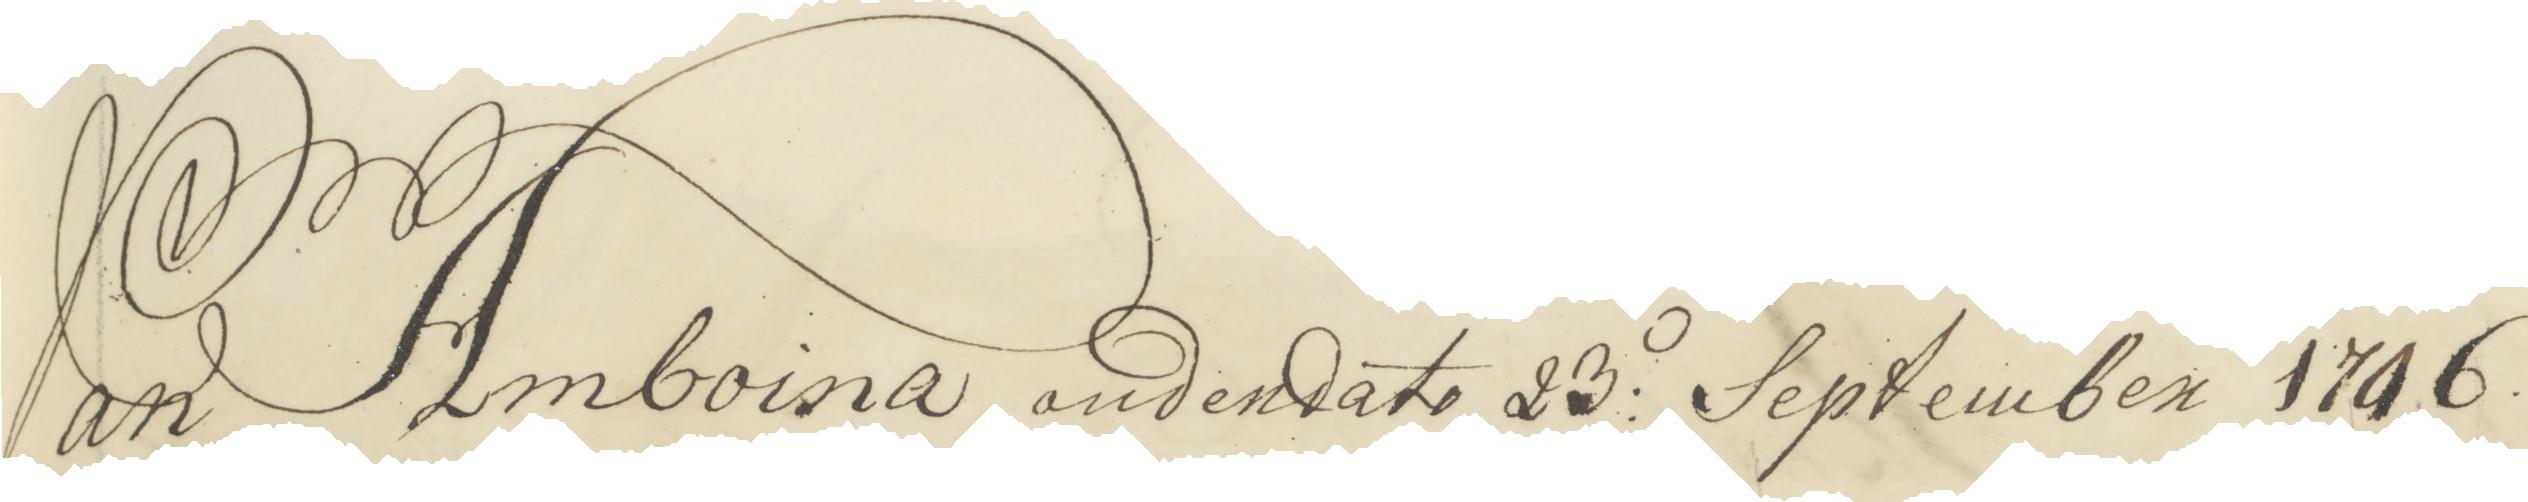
Van Amboina onder dato 23:e September 1746.
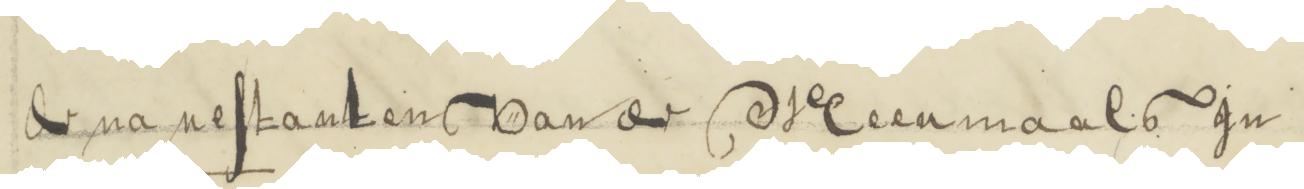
de na restanten van de Meermaals jn
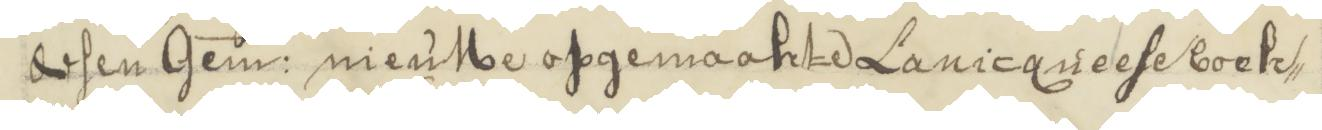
desen Gem: nieuwe opgemaakte Laricqueese boek„
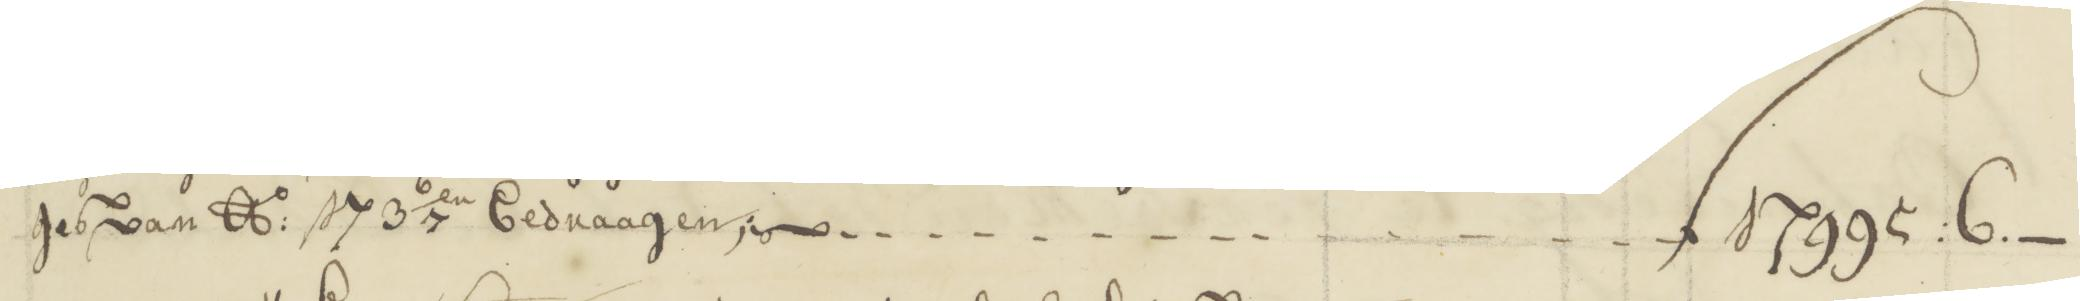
jes van A:o 17 3 6/en7 bedraagen; ~ - - - - - - - - - - - - -ƒ 17995: 6. —
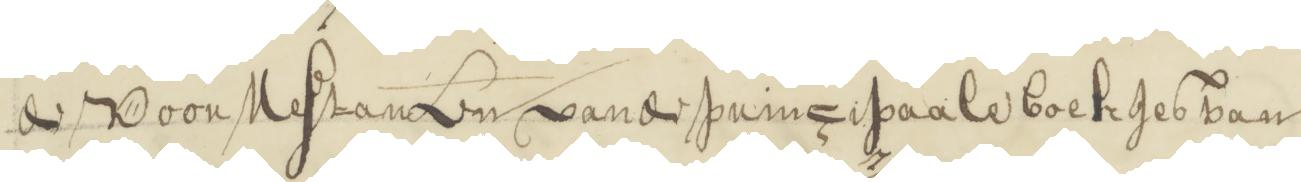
de voor Restanten van de principaale boekjes van
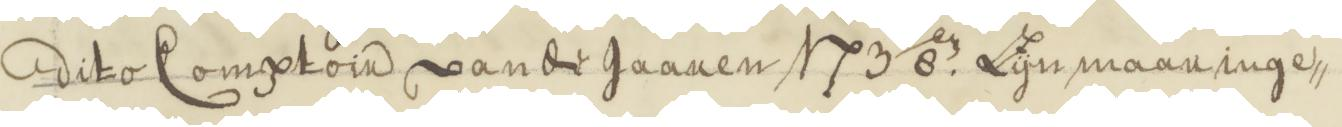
dito Comptoir van de jaaren 17 3 7/en8. Zijn maar inge„
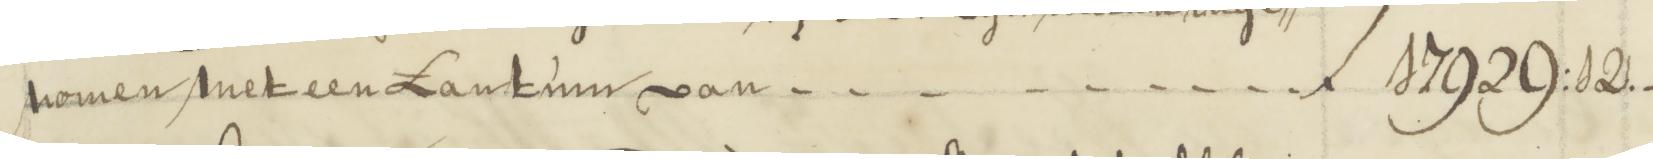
nomen met een tantum van - - - - - - - - ƒ 17929: 12. —
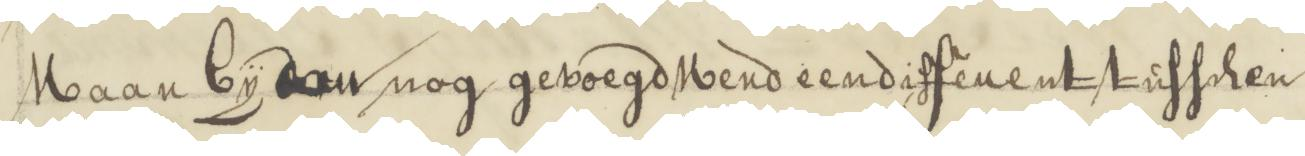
waar bij dan nog gevoegd werd een different tusschen
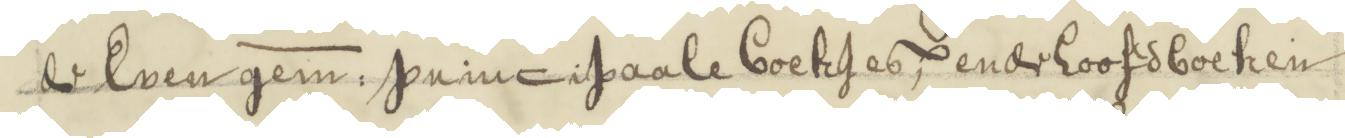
de Even gem: principaale boekjes; ende hoofd boeken
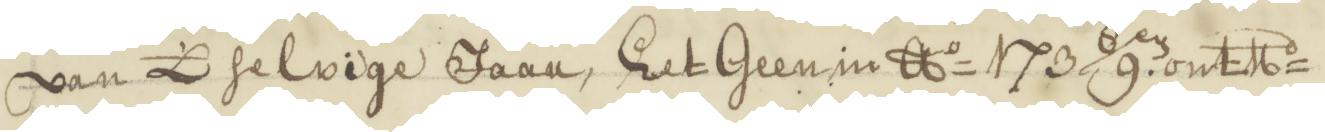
van 'T selvige Iaar, het Geen in A:o 173 8/en9. ontw=d
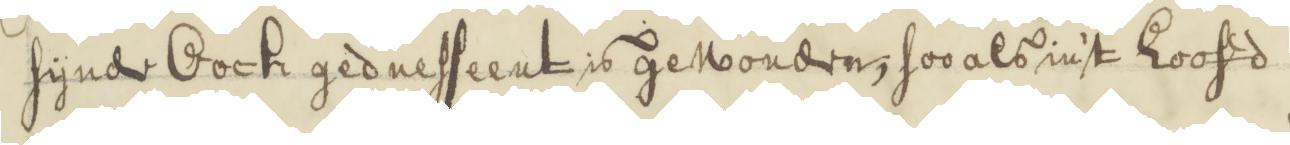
Sijnde Oock gedresseert is geworden, Soo als in’t hoofd
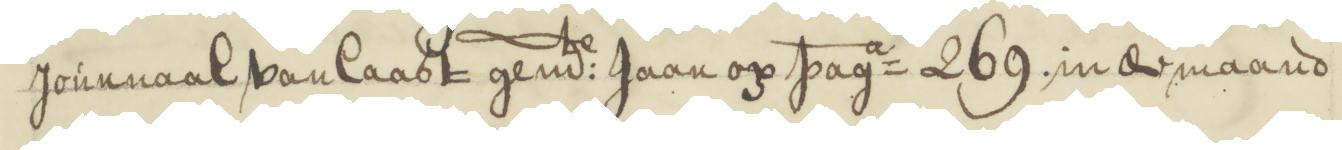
Journaal van laast gem:te Jaar op pag=a 269. in de maand
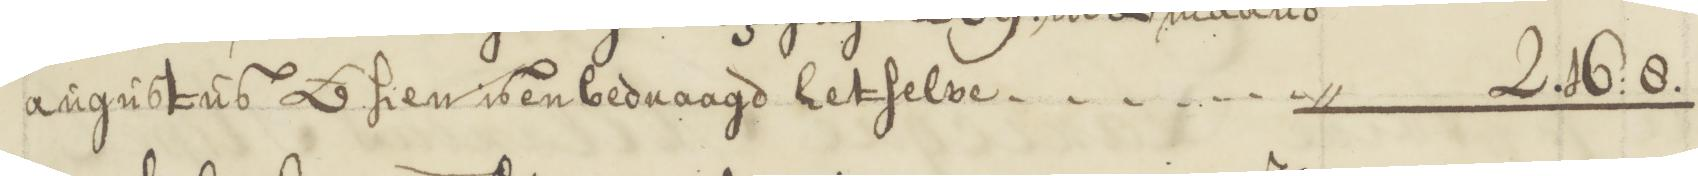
augustus Te Sien is en bedraagd het selve - - - - - - - „ 2. 16: 8.
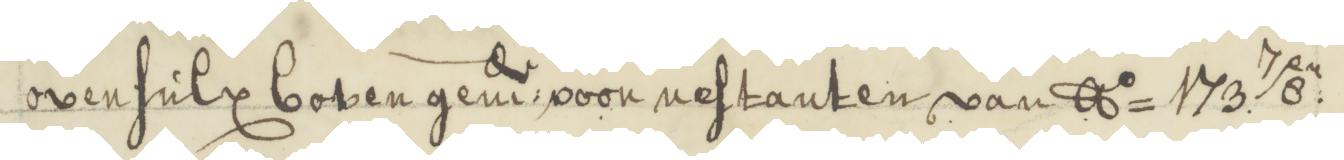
oversulx boven gem:de voor restanten van A=o 173 7/en8:
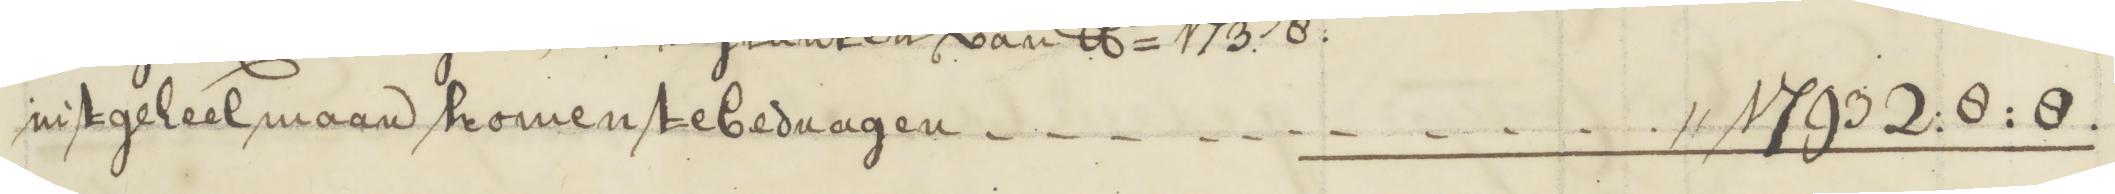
in't geheel maar komen te bedragen - - - - - - - - - - „ ƒ 17932: 8: 8.
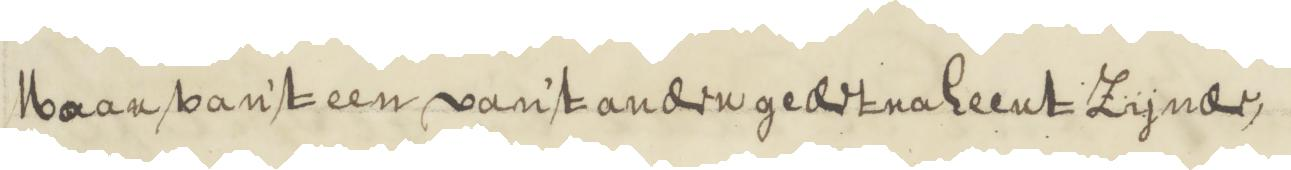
waar van’t een van’t ander gedetraheert Zijnde,
